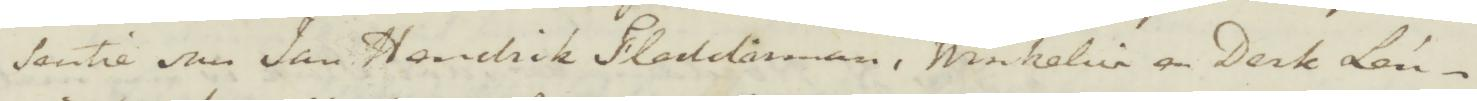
sentie van Jan Hendrik Fledderman, Winkelier en Derk Leu=
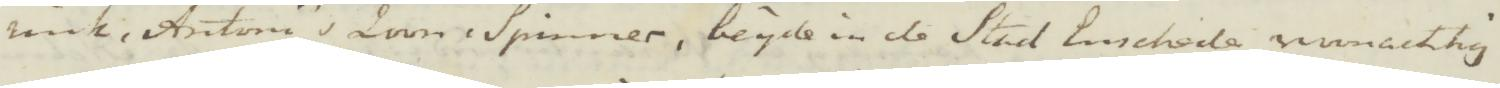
rink, Antoni's Zoon, Spinner, beijde in de Stad Enschede woonachtig
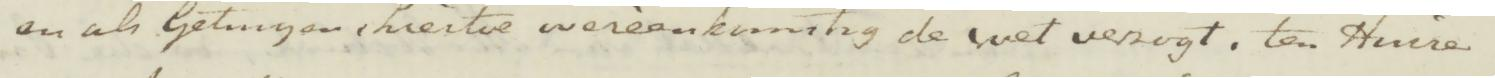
en als Getuigen, hiertoe overeenkomstig de wet verzogt, ten Huize
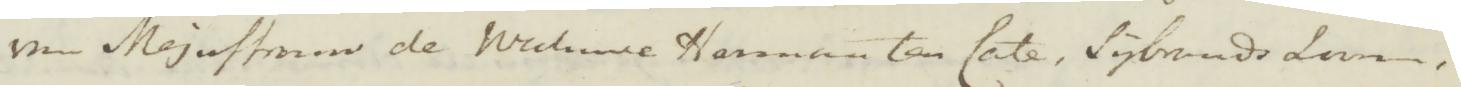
van Mejuffrouw de Weduwe Herman ten Cate, Sijbrands Zoon,
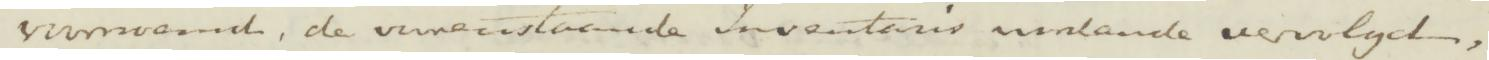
voornoemd, de voorenstaande Inventaris wordende vervolgd,
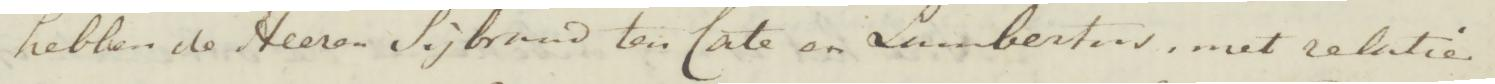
hebben de Heeren Sijbrand ten Cate en Lambertus, met relatie
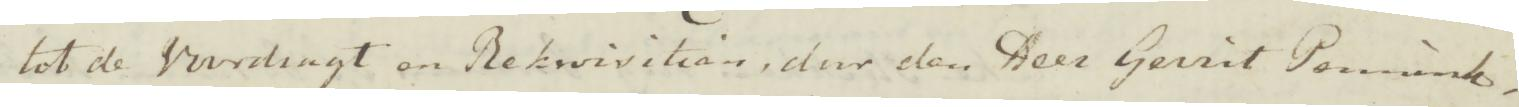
tot de Voordragt en Rekwisitien, door den Heer Gerrit Pennink
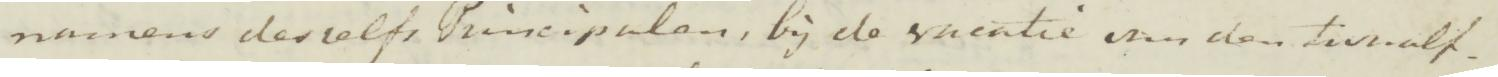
namens deszelfs Principalen, bij de vacatie van den twaalf.
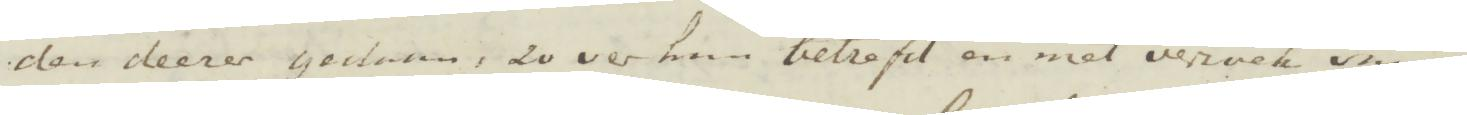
den deezer gedaan, zo ver hun betrefd en met verzoek van
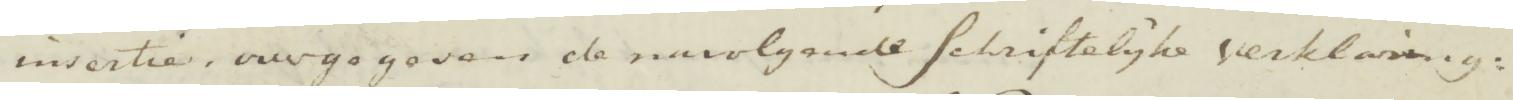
insertie, overgegeven de navolgende schriftelijke verklaring:
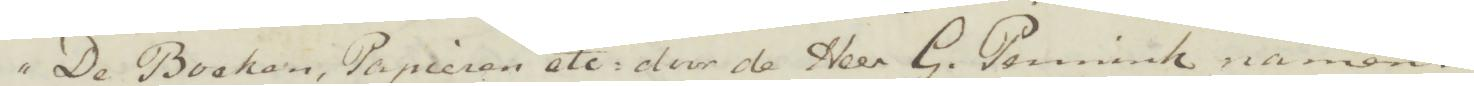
„ De Boeken, Papieren etc: door de Heer G. Pennink namens
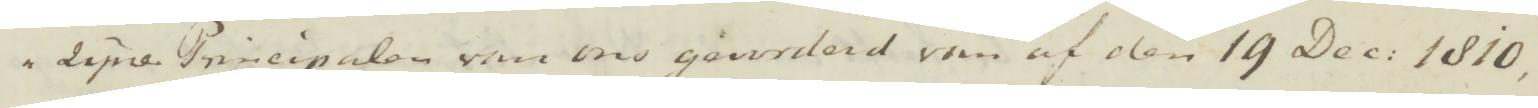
„ zijne Principalen van ons gevorderd van af den 19 Dec: 1810,
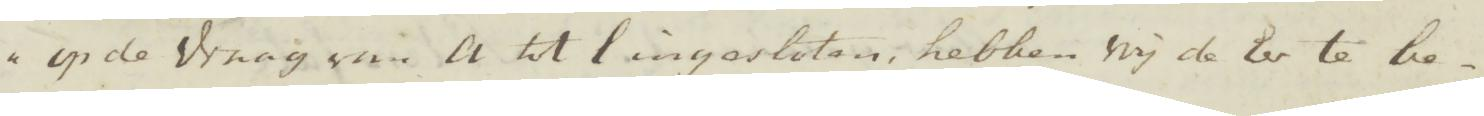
„ op de Vraag van A tot l ingesloten, hebben wij de Eer te be=
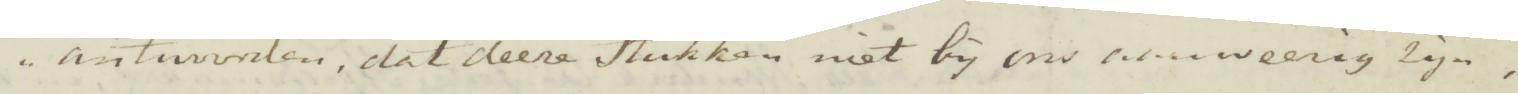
„antwoorden, dat deeze Stukken niet bij ons aanweezig zijn,
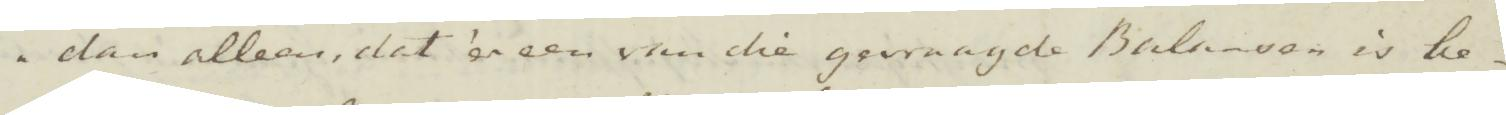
„dan alleen, dat er een van die gevraagde Balansen is be„
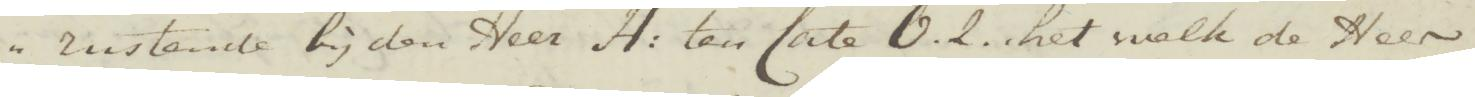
„ rustende bij den Heer H: ten Cate O.Z. het welk de Heer
